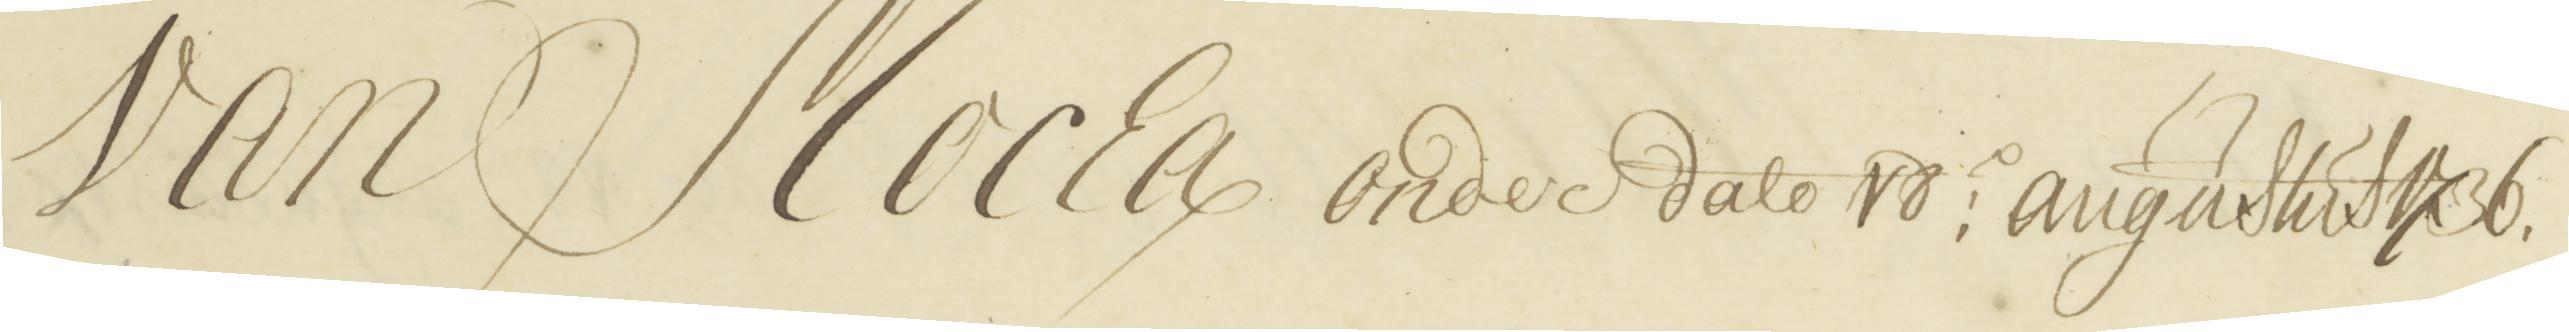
Van Mocha onder dato 18:e augustus 1736.
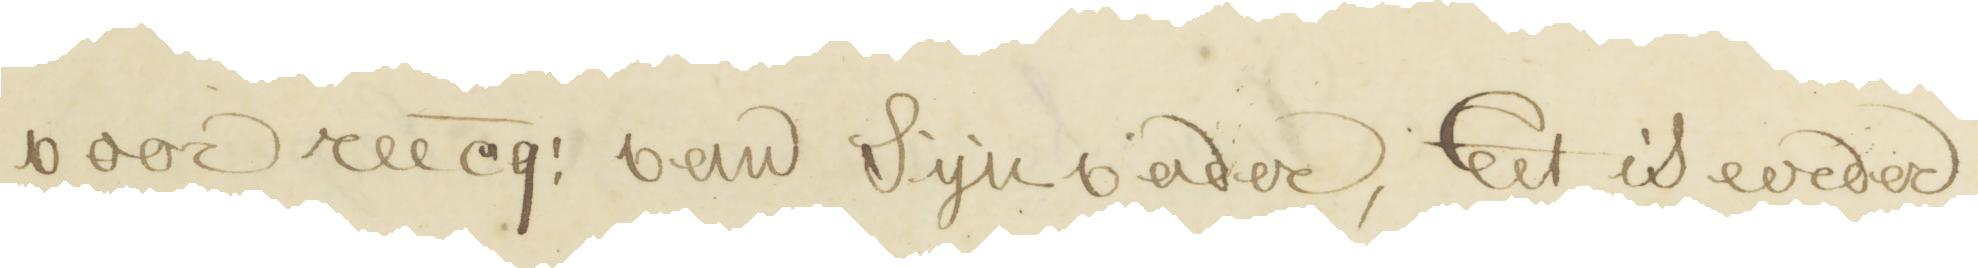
voor reecq: van sijn vader, het is eerder
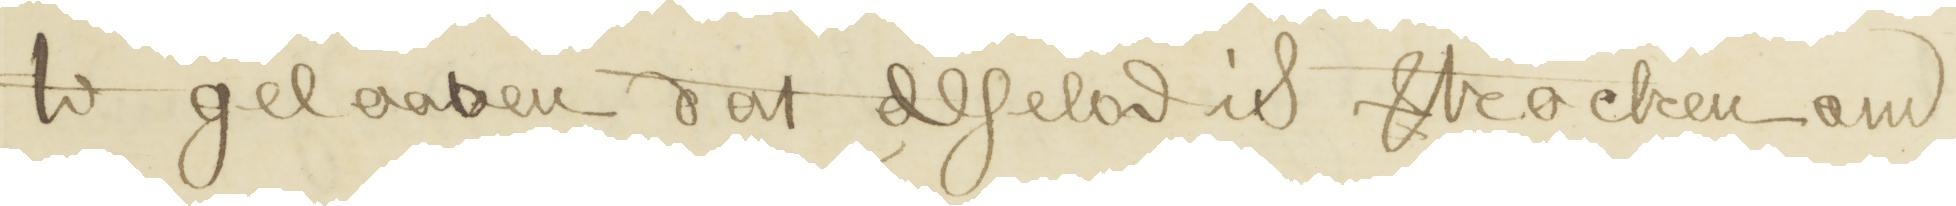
te gelooven dat deselve is vertrocken om
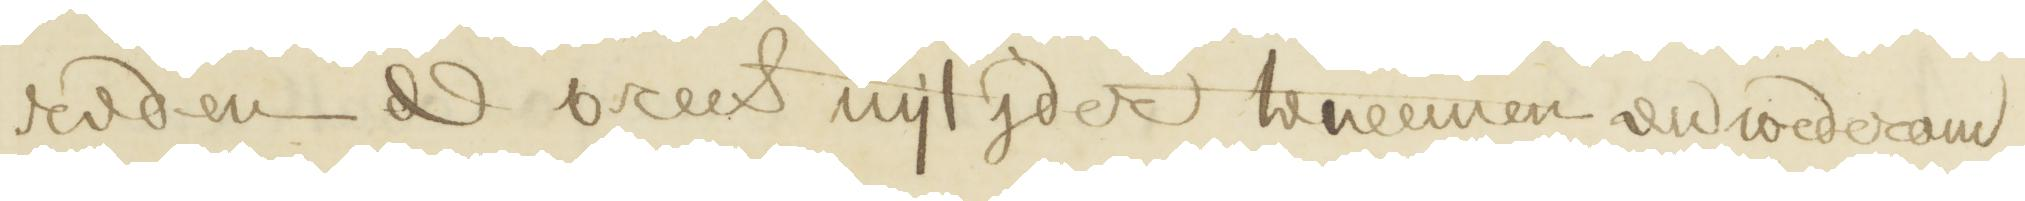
reden de vrees uijt jder teneemen en wederom
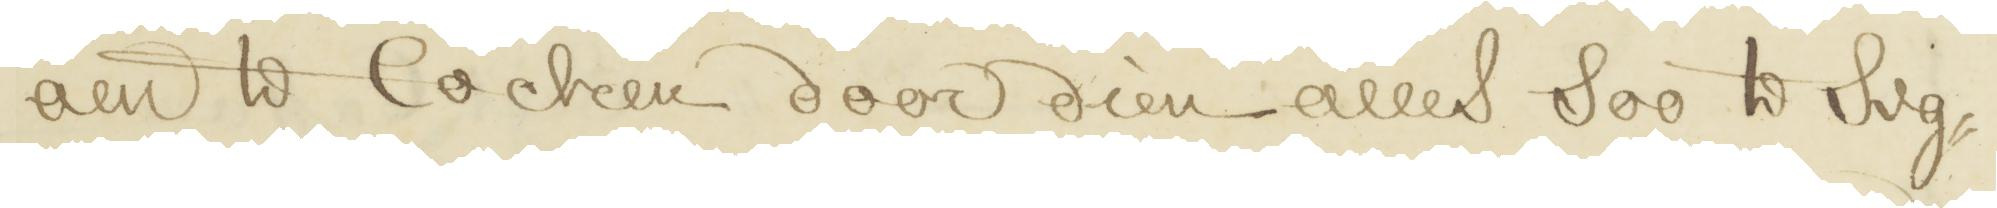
aen te locken door dien alles soo te seg„
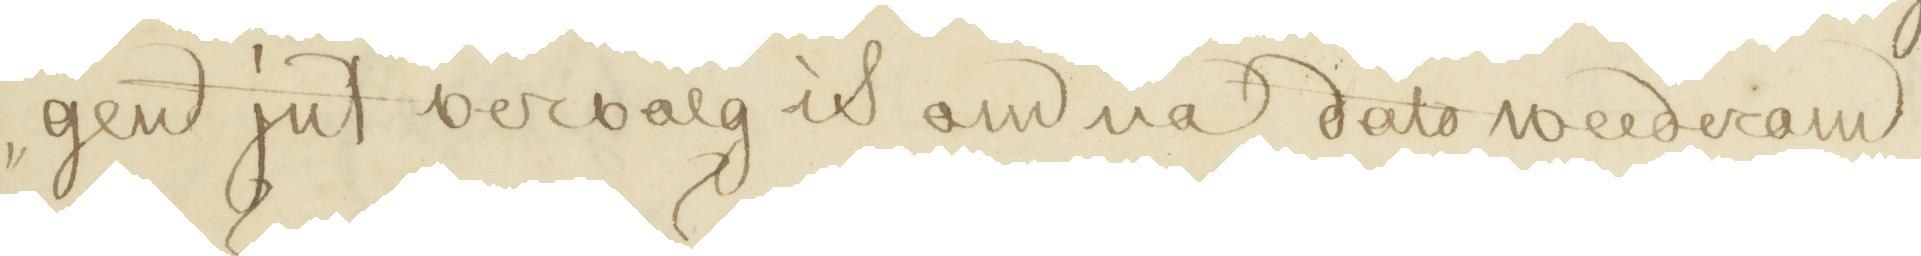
„gen jnt vervolg is om na dato weederom
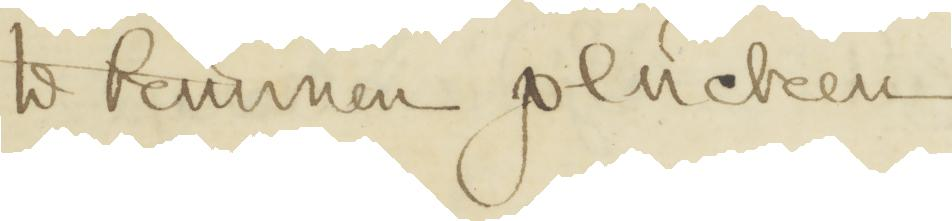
te kunnen plucken
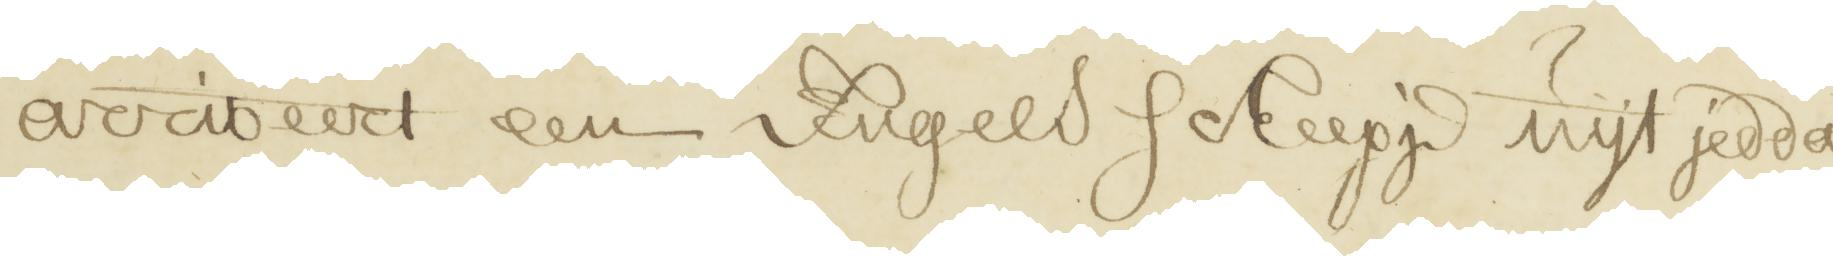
arriveert een Engels scheepje uijt jedda
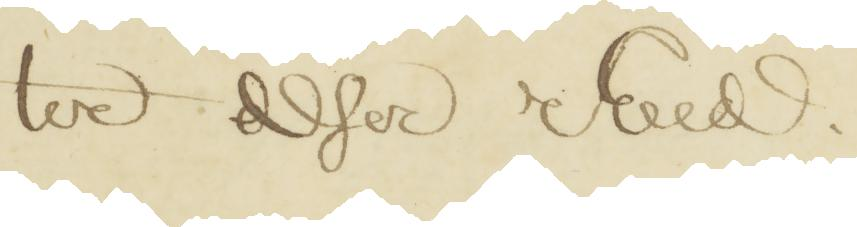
ter deser rheede.
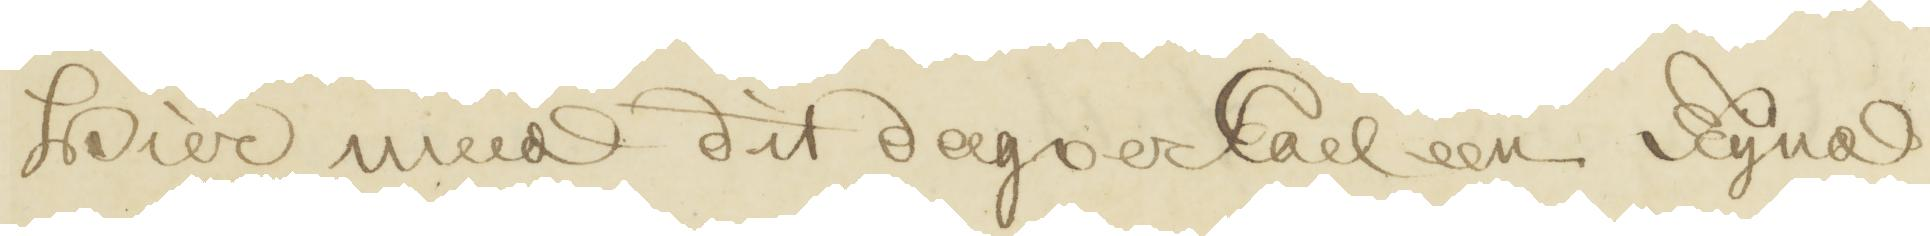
Hier meede dit dagverhael een Eijnde
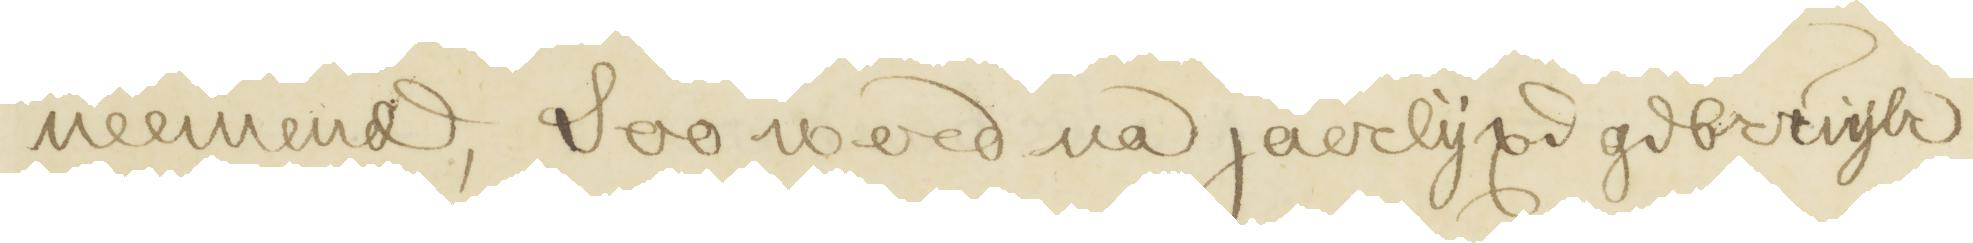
neemende, soo werd na jaerlijxe gebruijk
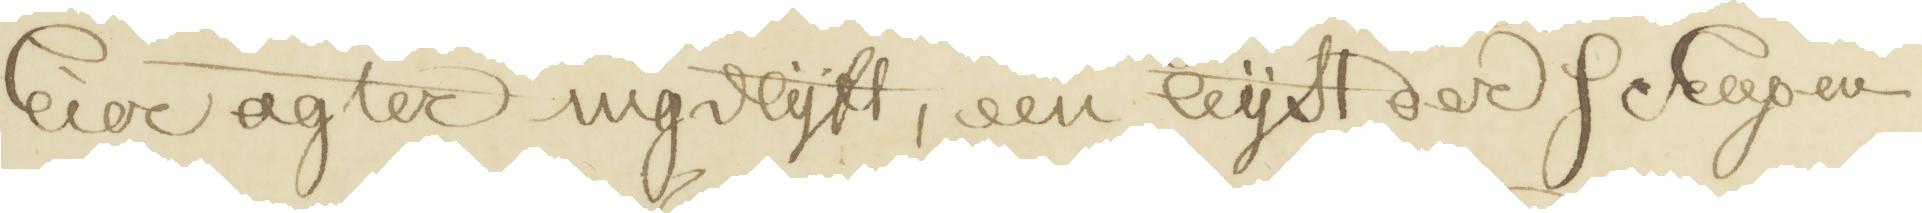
hier agter ingelijft, een leijst der scheepen
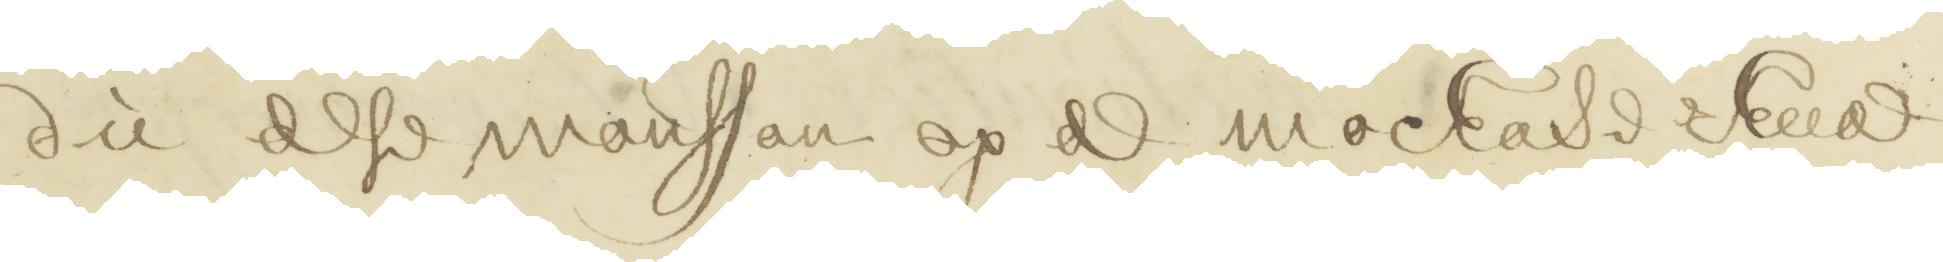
die dese mousson op de mochase rheede
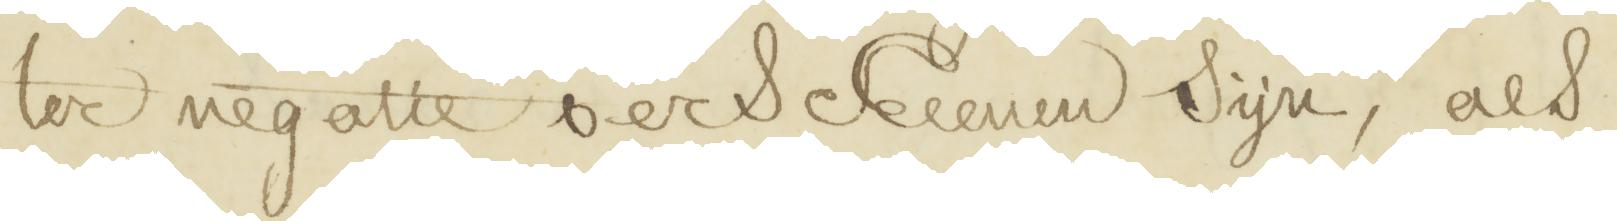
ter negotie verscheenen sijn, als
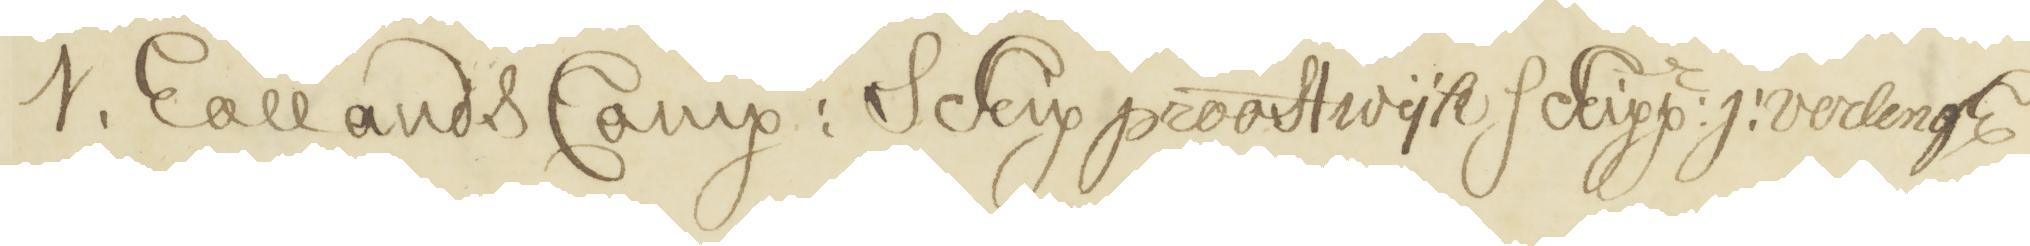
1. hollands Comp:s schip proostwijk schipp:r j:verlengh
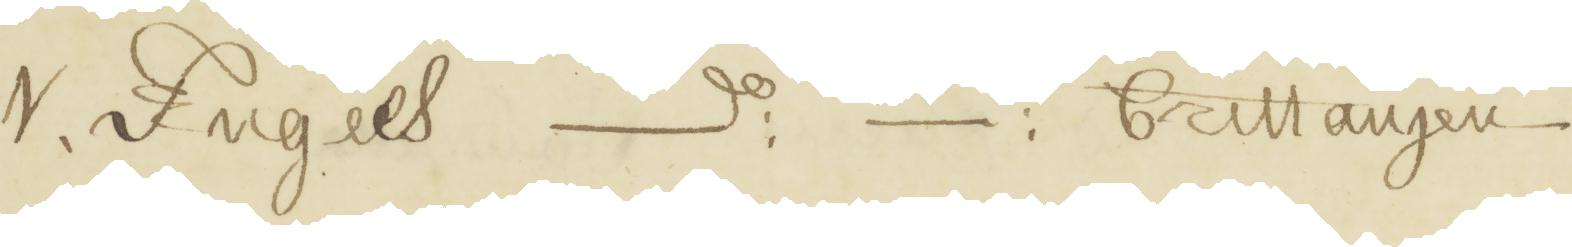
1. Engels _:o _:o brittanjen
